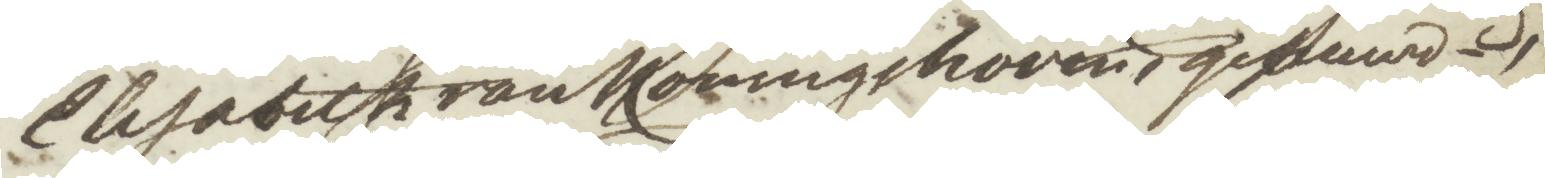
Elisabeth van Koningshoven, gehuwd - ,
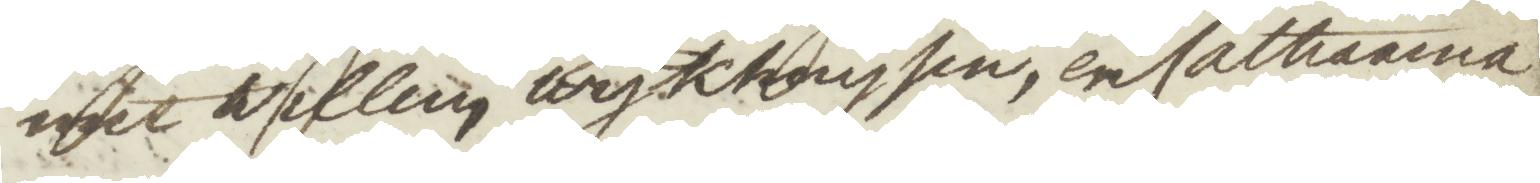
met willem wykhuysen, en Catharina
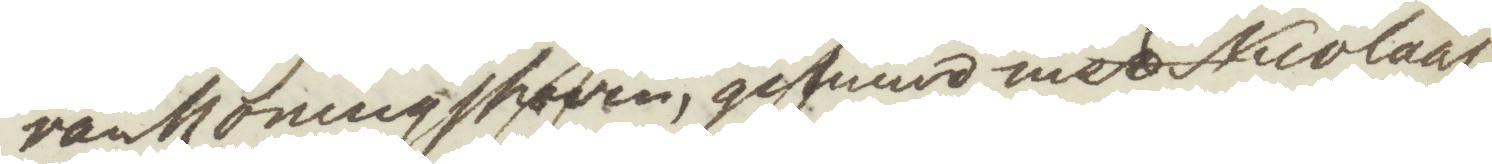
van Koningshoven, gehuwd met Nicolaas
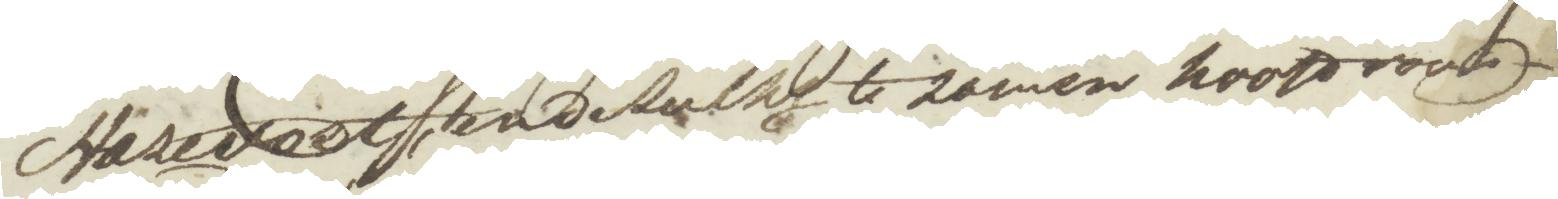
Hazevoet, ende zulks te zamen hoofd voor
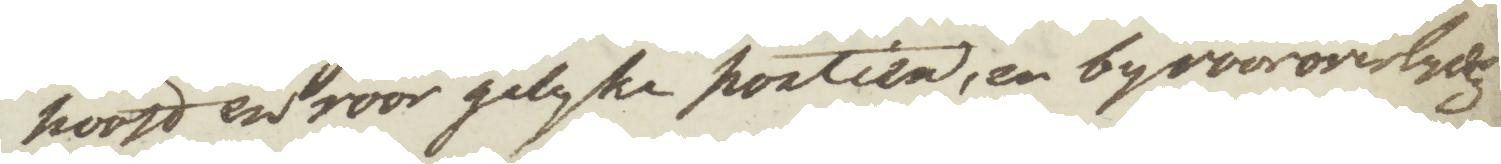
hoofd en voor gelyke portien, en by vooroverlyden
